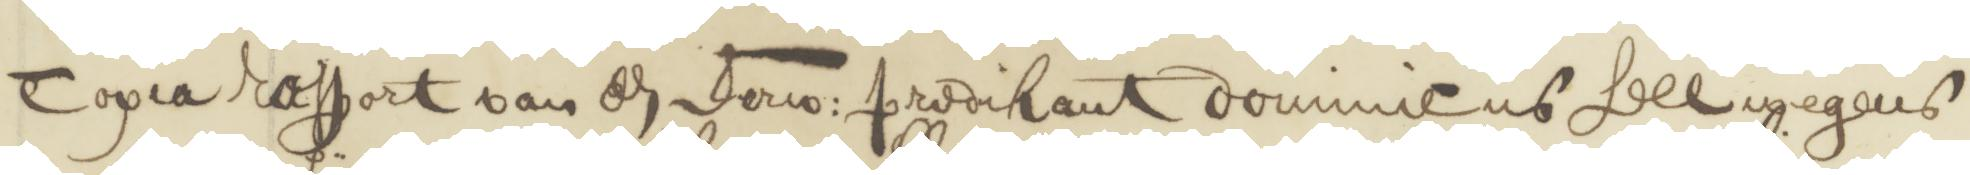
Copia rapport van den Eerw: predikant domimicus Sell wegens
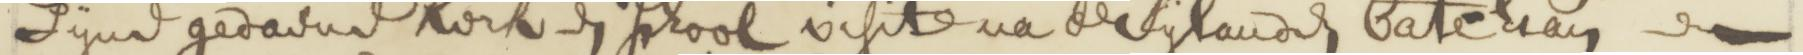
sijne gedaene kerk en School visite na de Eijlanden batchian en
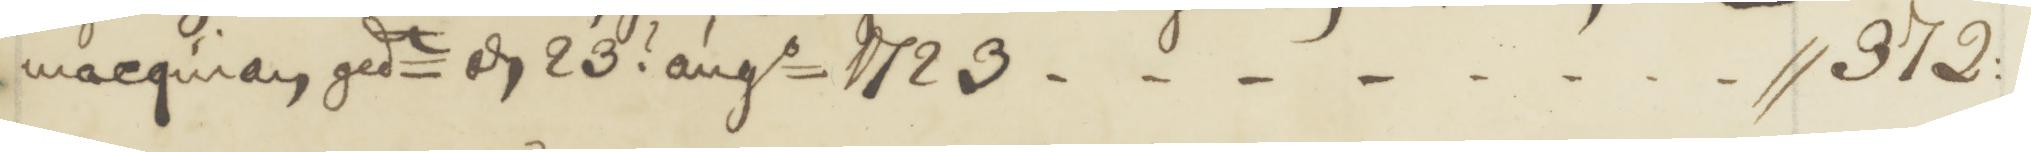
macquian ged=t en 23:' aug=o 1723 - - - - - - - - „ 372:
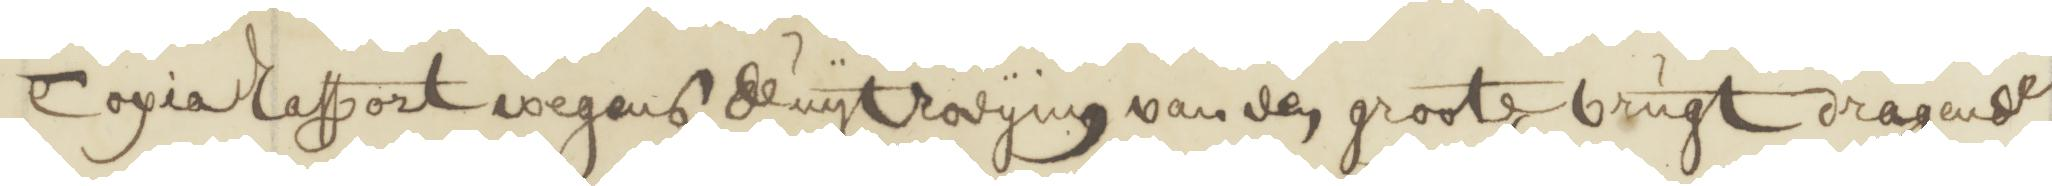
Copia Rapport wegens de uijtroeijing van een groote vrugt dragende
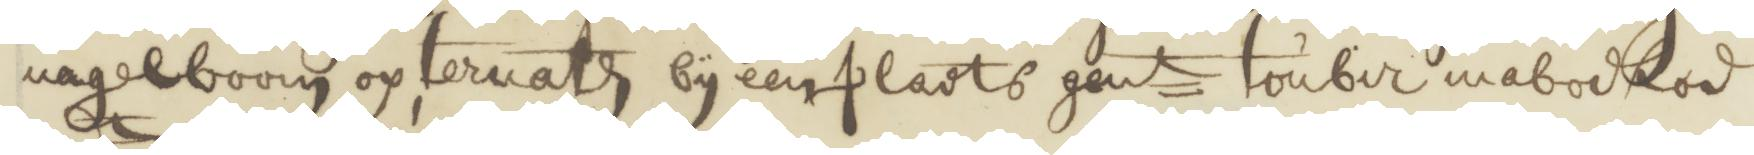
nagelboom op ternaten bij een plaets gen=t toubir maboekoe
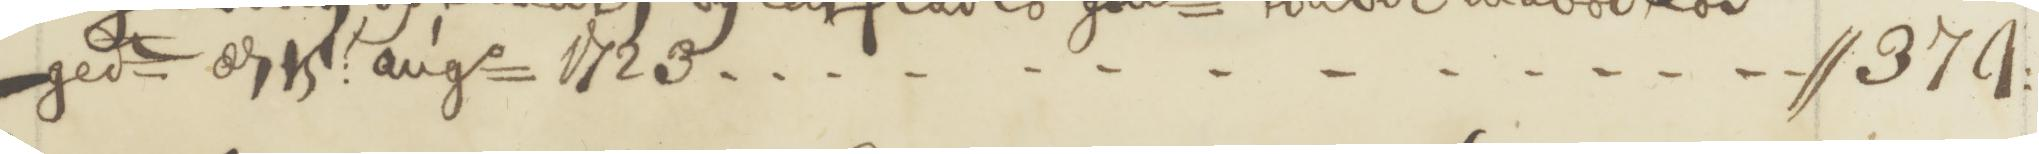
ged=t den 15:' aug=o 1723 - - - - - - - - - - - - - - - „ 374:
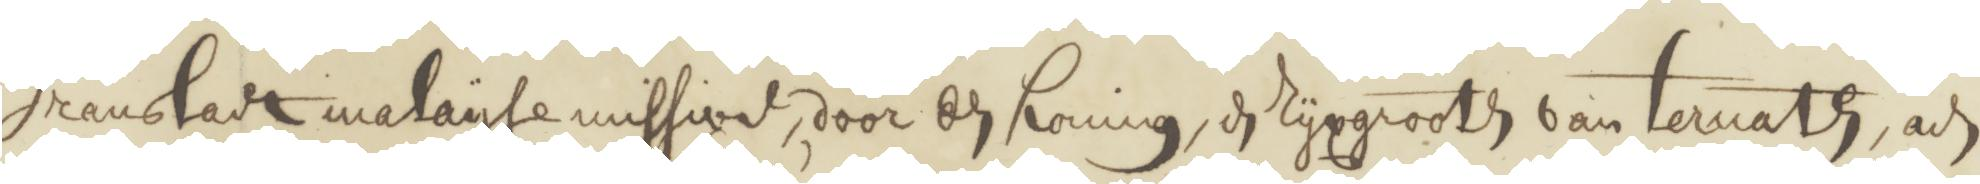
Translast malaijse missive, door den koning, en Rijxgrooten van Ternaten, aen
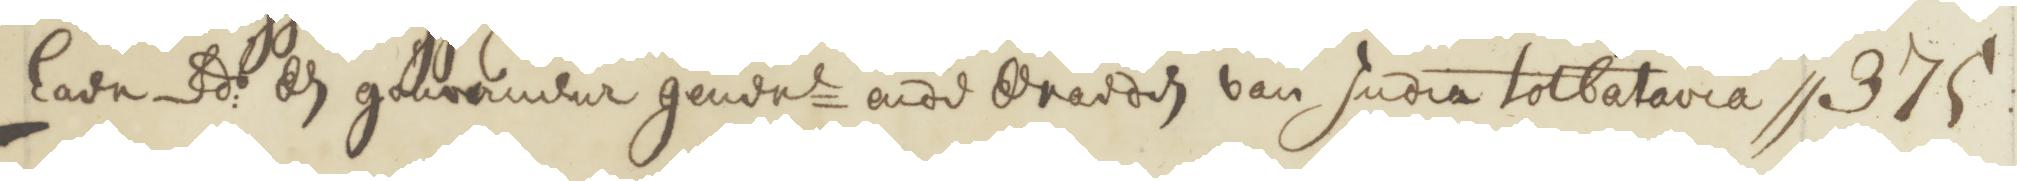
haer Ed:s den gouverneur gener=l ende de raeden van Jndia tot batavia „ 375:
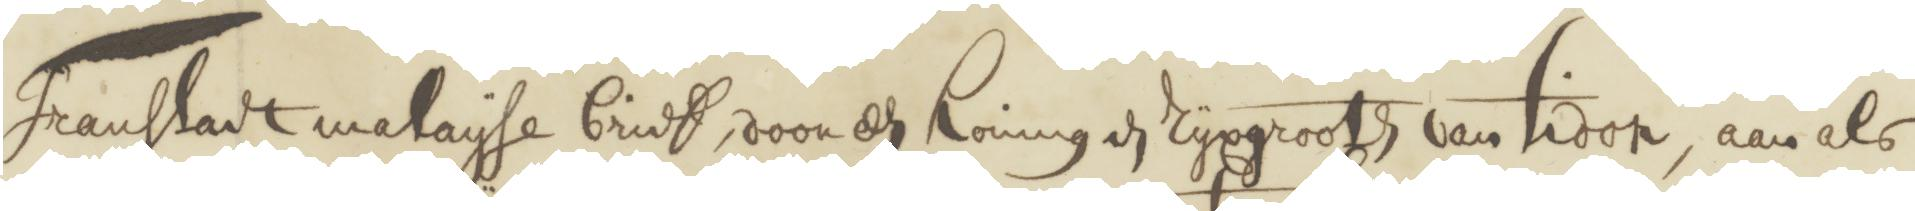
Translaet malaijse brief, door den Koning en Rijxgrooten van Tidor, aan als
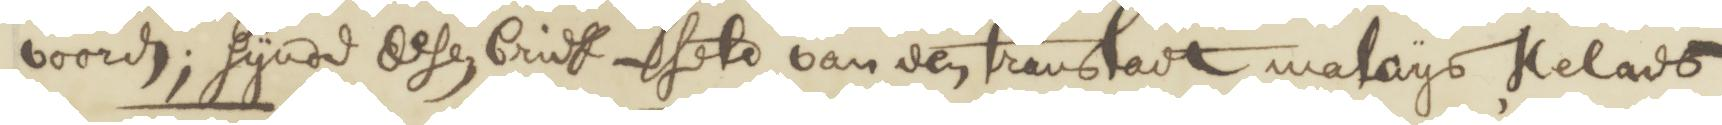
vooren; sijnde desen brieff verseld van een translaet malaijs Relaes
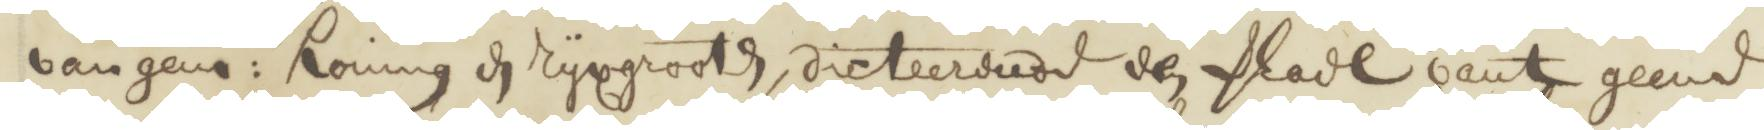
van gem: Koning en Rijxgrooten, dicteerende een verhael van’t geene
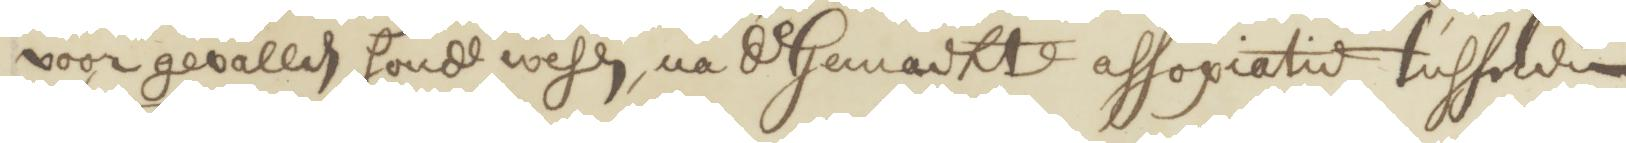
voor gevallen soude wesen, na de Gemaekte assopiatie tusschen
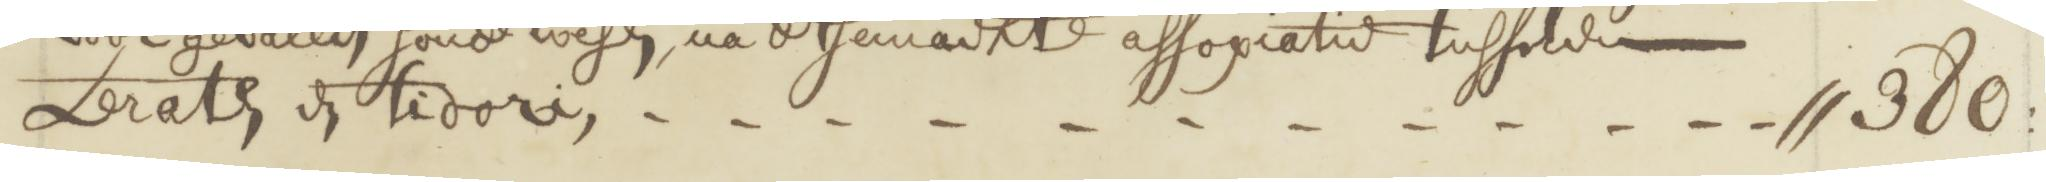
Teraten en tidori, - - - - - - - - - - - - - - - „ 380:
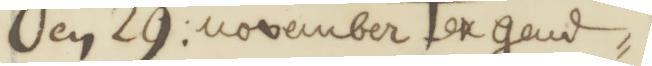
den 29:' november ter gene„
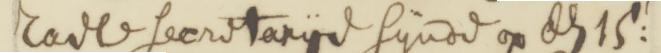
raele Secretarije sijnde op den 15:'
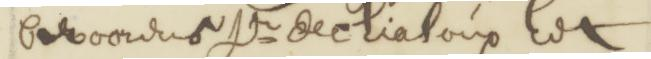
bevoorens P=r de chialoup het
